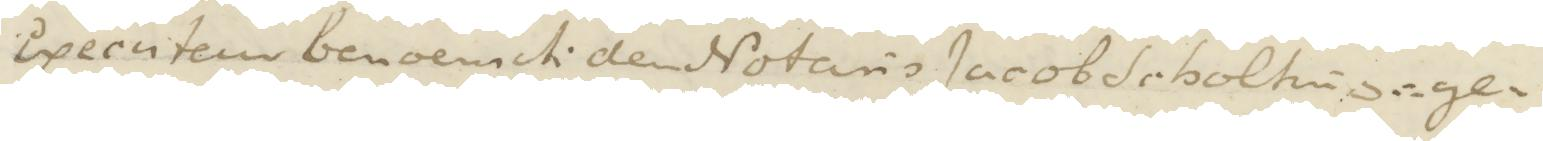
Executeur benoem ik den Notaris Jacob scholting =ge-
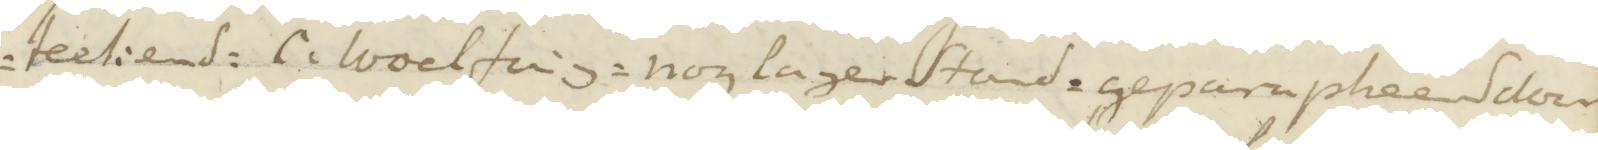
=teekend= C. Woelfing= nog lager stond= geparapheerd door
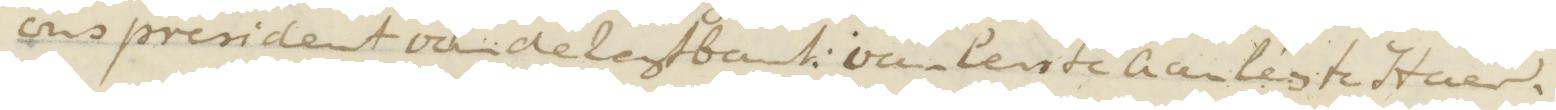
ons president van de Regtbank van Eerste Aanleg te Haar:
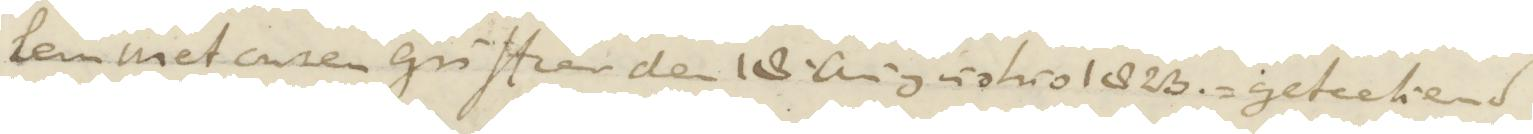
lem met onsen griffier den 18. Augustus 1823.= geteekend
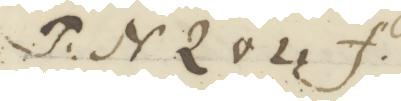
P: N 204 f:
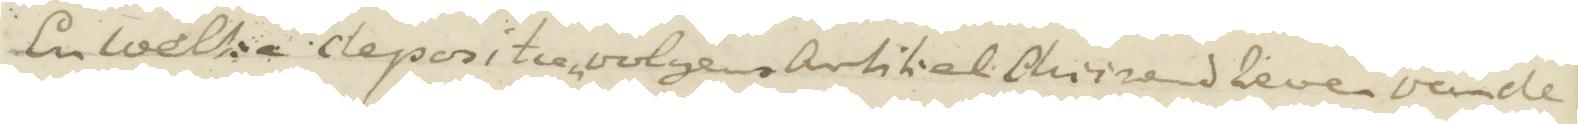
En welke depositie, volgens Artikel duizend Zeven van de
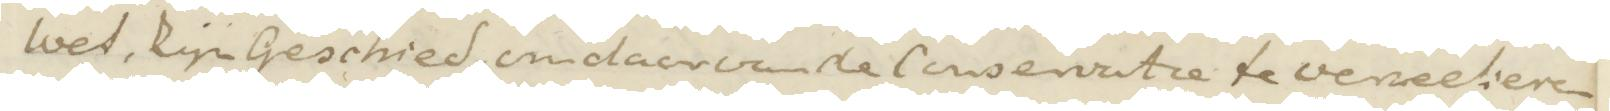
wet, Zijn Geschied om daarvan de Conservatie te verzeekeren
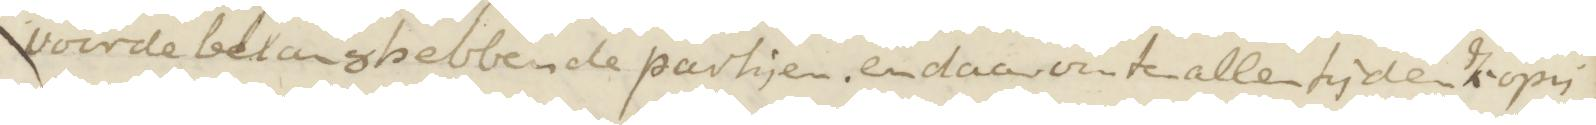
voorde belang hebbende partijen, en daarvan ten allen tijden Kopij
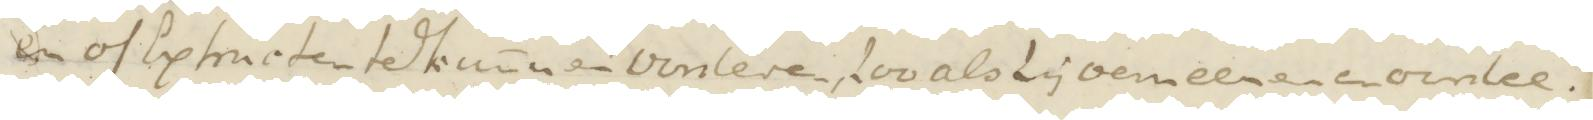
en of Extracten te kunnen vorderen, zoo als zij vermeenen en oordee.
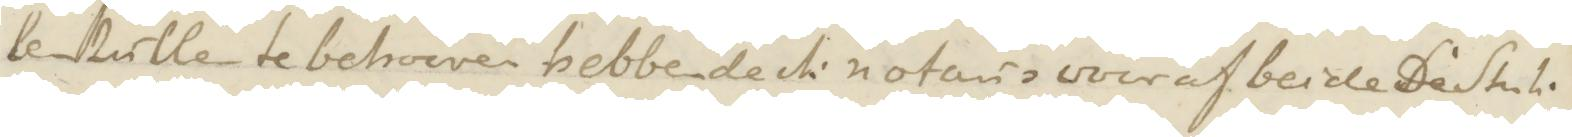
le Zullen te behooren hebbende ik notaris vooraf beide De stuk.
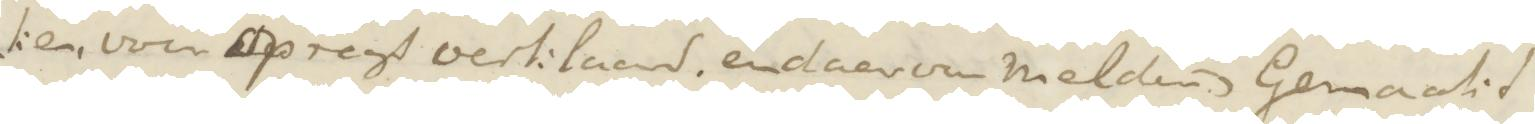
ken voor opregt verklaard, en daar van melding Gemaakt
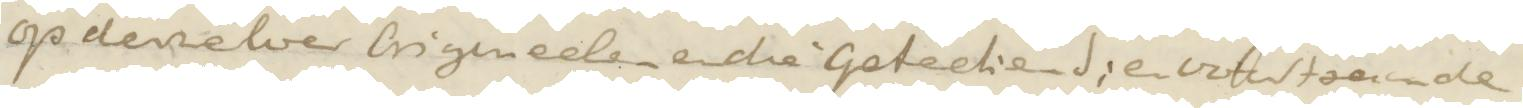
op dezelve Origineelen en die geteekend: en voorstaende
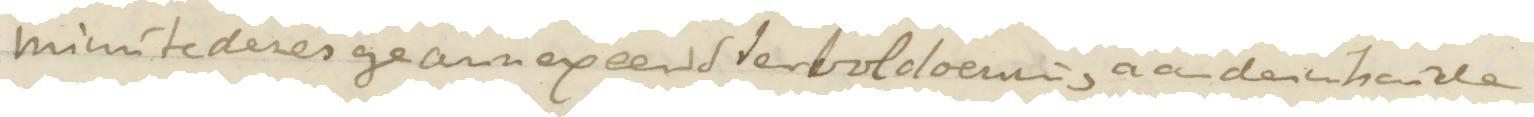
minute dezes geannexeerd ter voldoening aan de inhoude
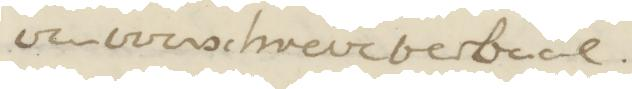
van voorschreve verbaal.
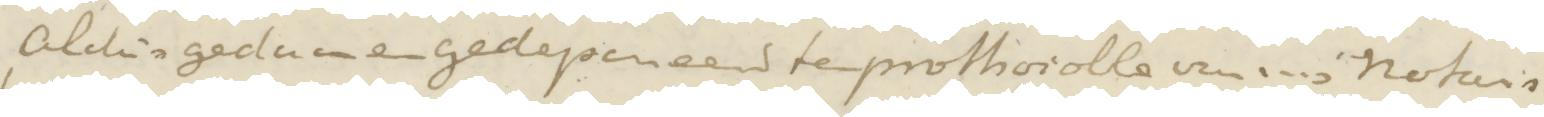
Aldus gedaan en gedeponeerd ten prothocolle van my Notaris
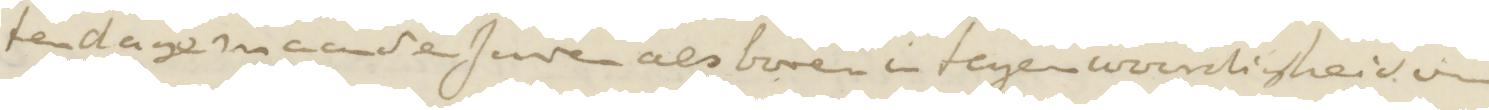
ten dage maand en Jare als boven in tegenwoordigheid van
